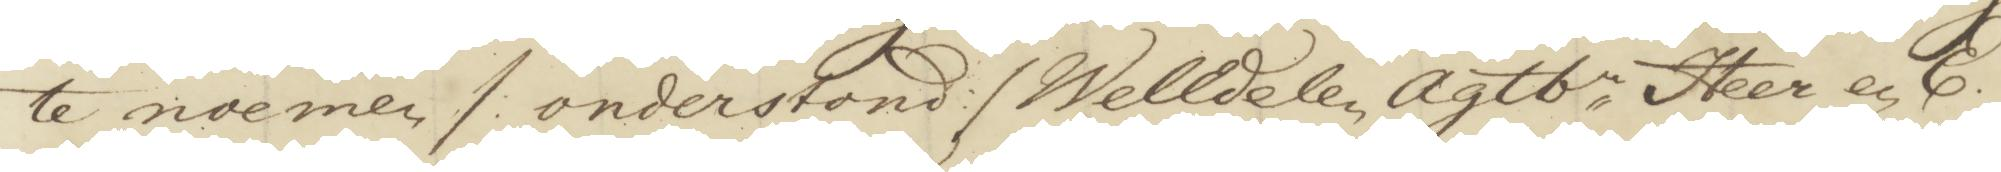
te noemen /:onderstond:/ WelEdelen agtb„r Heer en E.
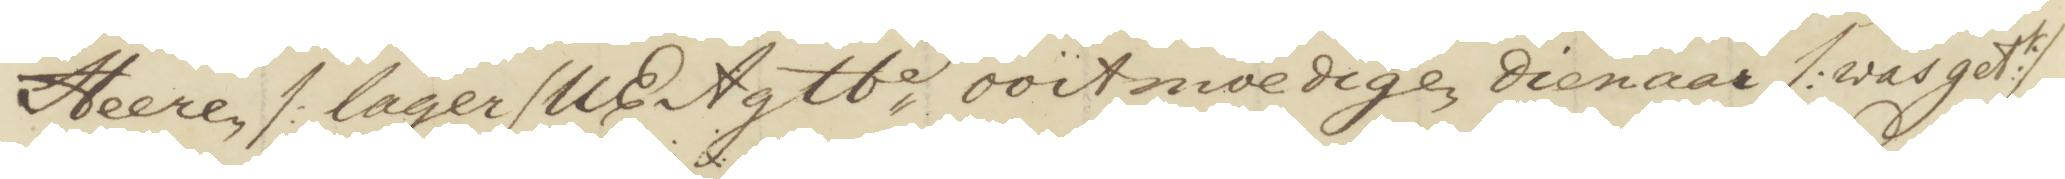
Heeren /:lager/ UE Agtb„e ooïtmoedigen dienaar /:was get:k/
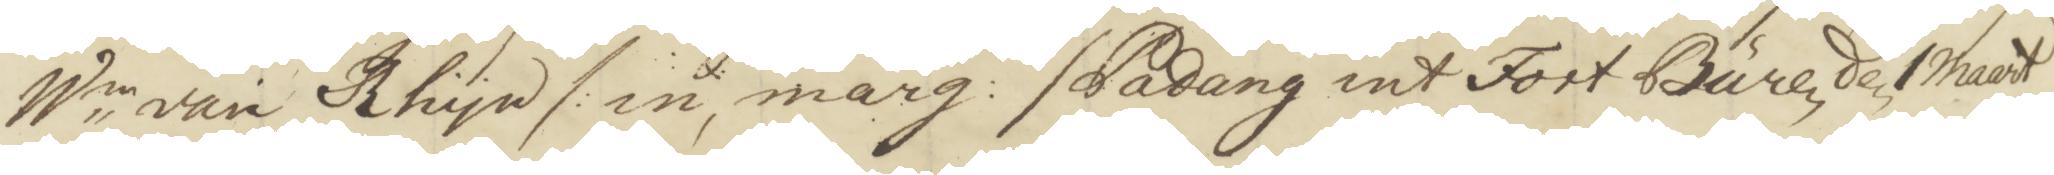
W„m van Rhijn /:in, marg: / Padang in t Fort Buren den 1 Maart
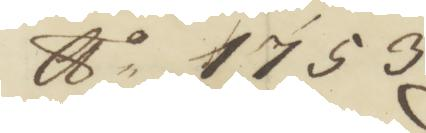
A„o 1753.
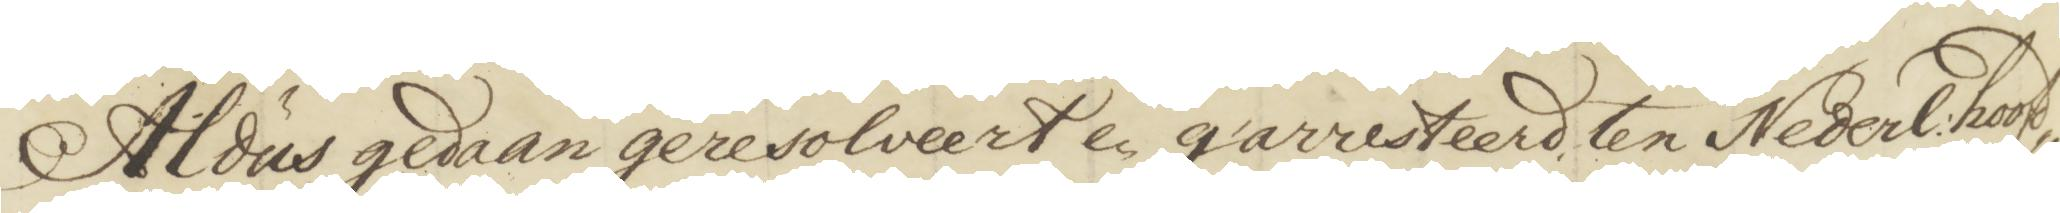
Aldus gedaan geresolveert en g'arresteerd ten Nederl:hoofd„
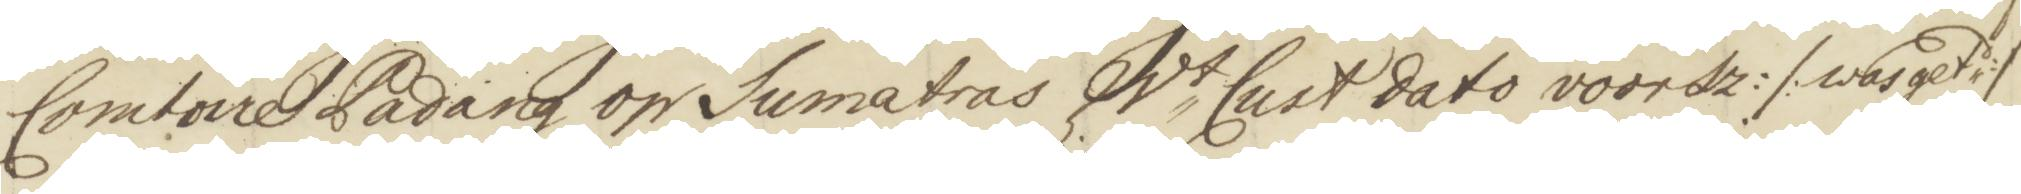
Comtoire Padang op Sumatras W„t Cust dato voorsz: /:was get„d:/
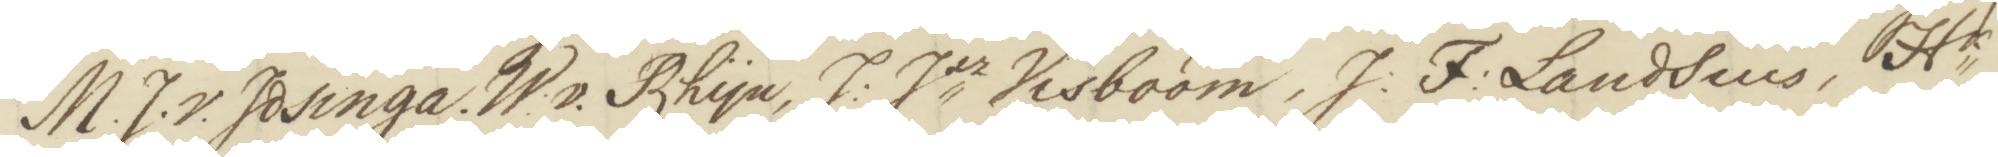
M.J.v. Jdsinga. W:v. Rhijn, J: J„sz Visboom, J: F: Landhuis, H„k
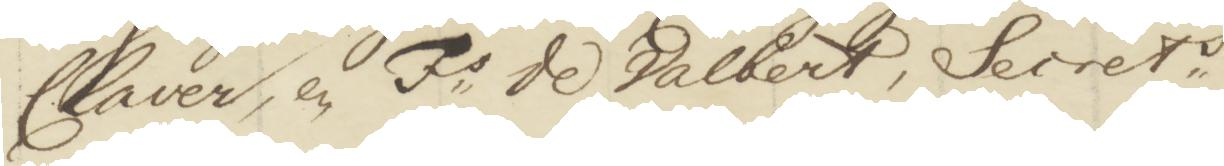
Claver, en F„s de Valbert, Secret„s
